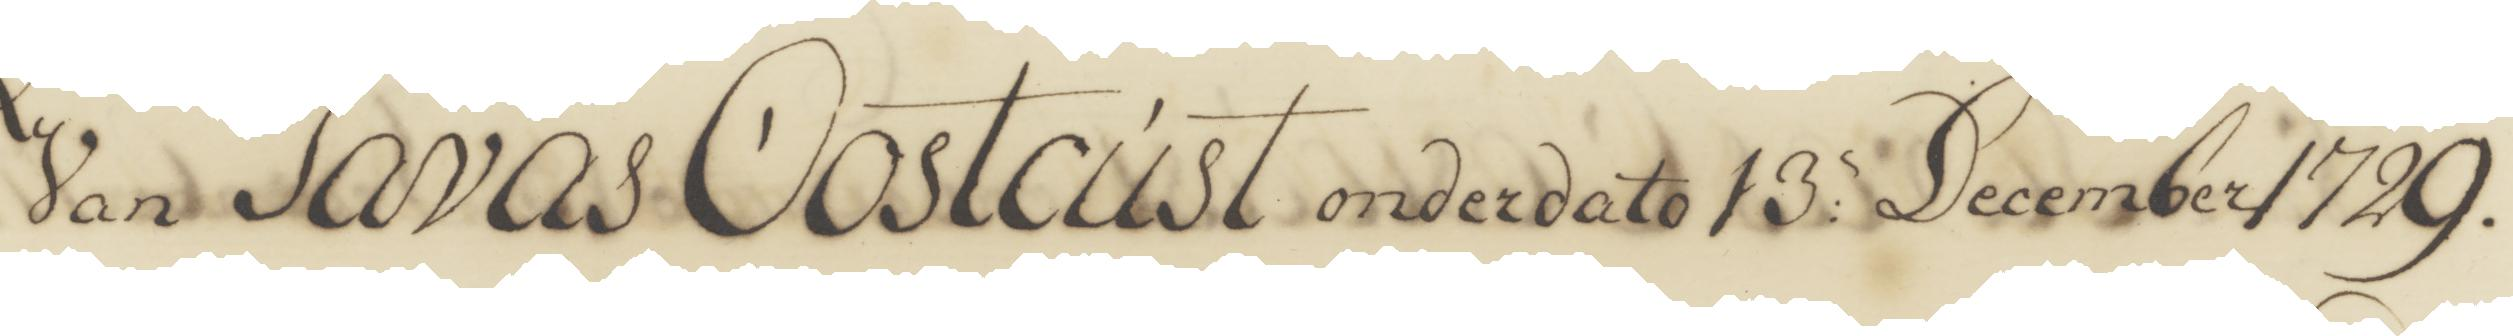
Van Javas Oostcust onderdato 13:' December 1729.
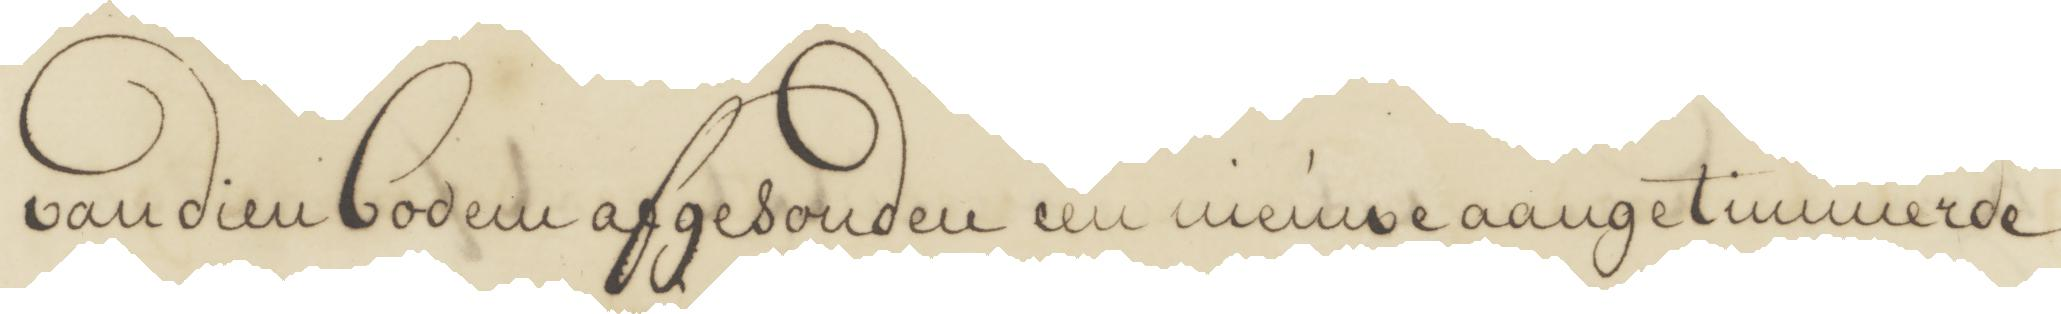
van dien bodem afgesonden een nieuwe aangetimmerde
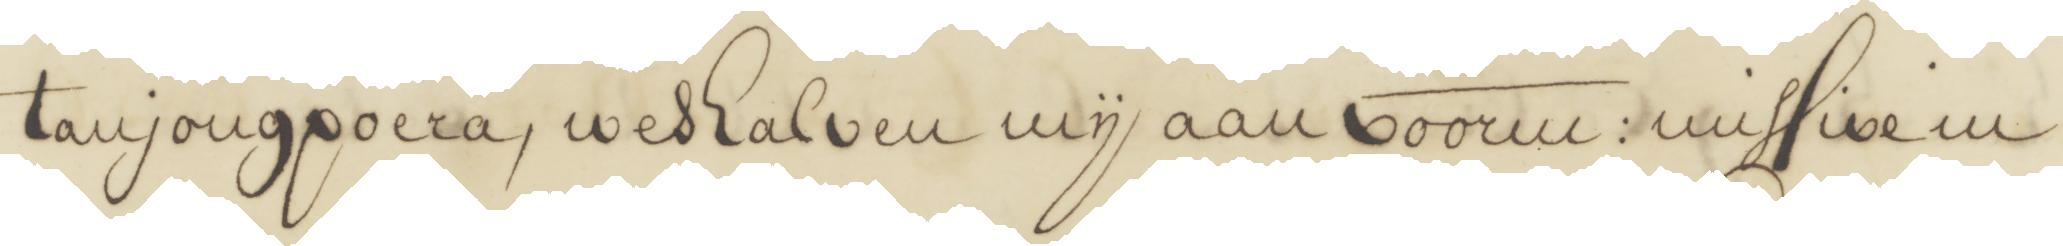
tanjongpoera, weshalven wij aan voorm: missive in
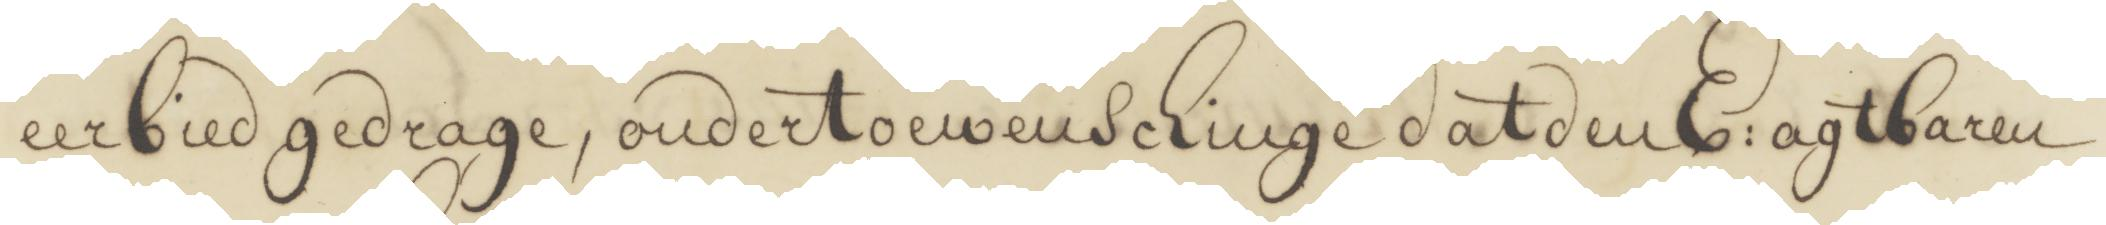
eerbied gedrage, ondertoewenschinge dat den E: agtbaren
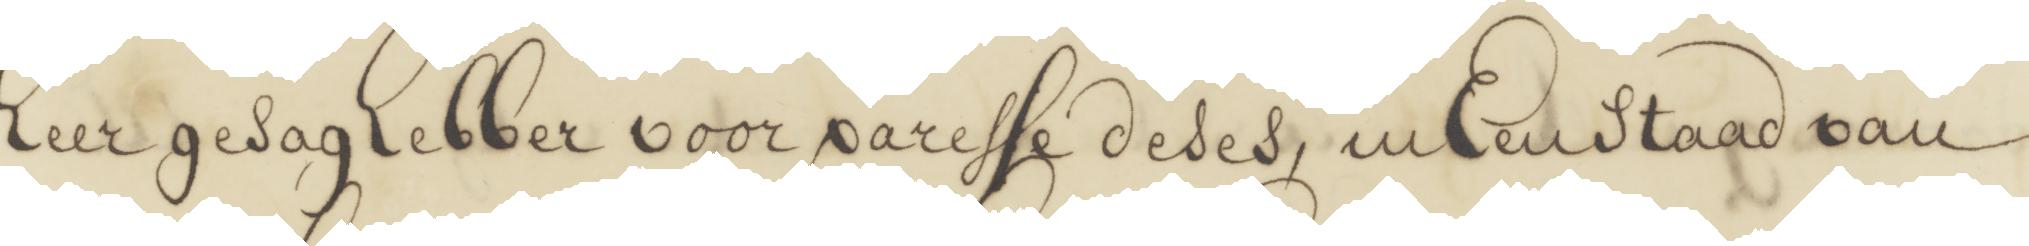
heer gesaghebber voor paresse deses, in Een staad van
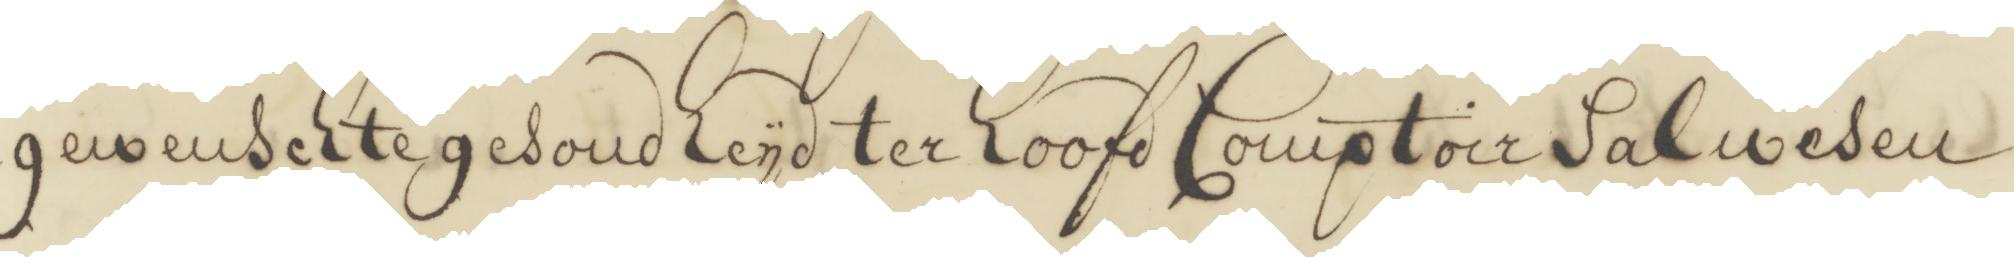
gewenschte gesondheijd ter hoofd Comptoir sal wesen
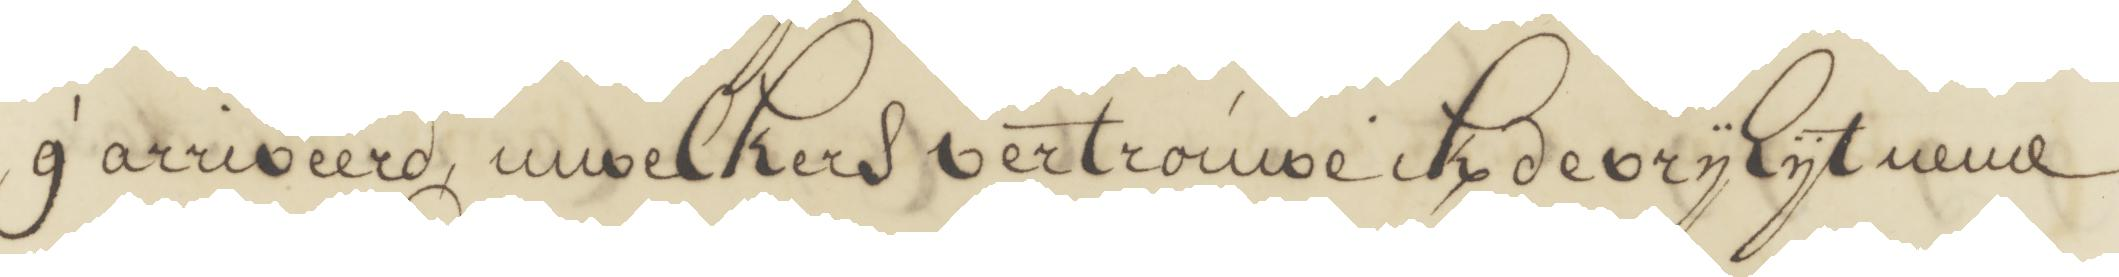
g’arriveerd, inwelkers vertrouwe ik de vrijhijt neme
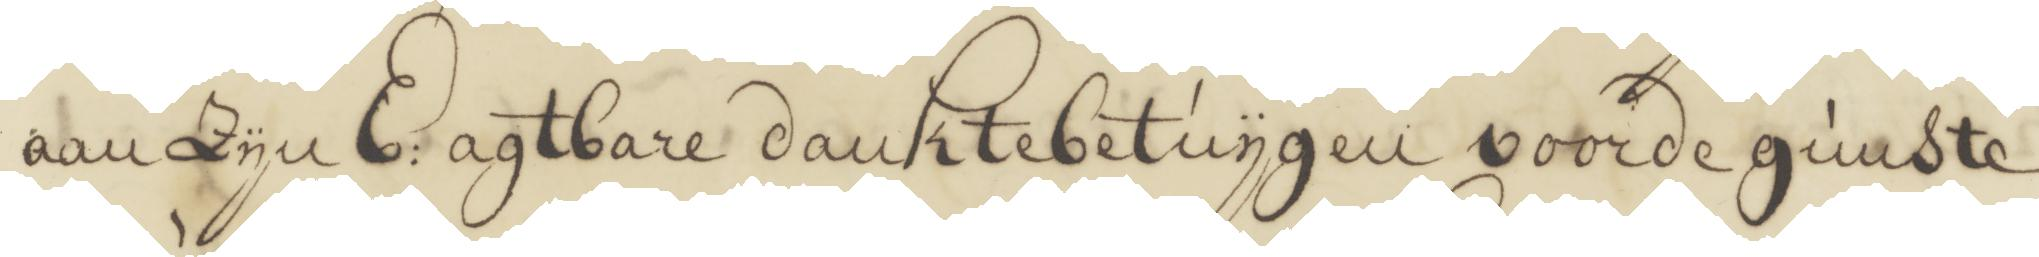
aan zijn E: agtbare dank te betuijgen voor de gunste
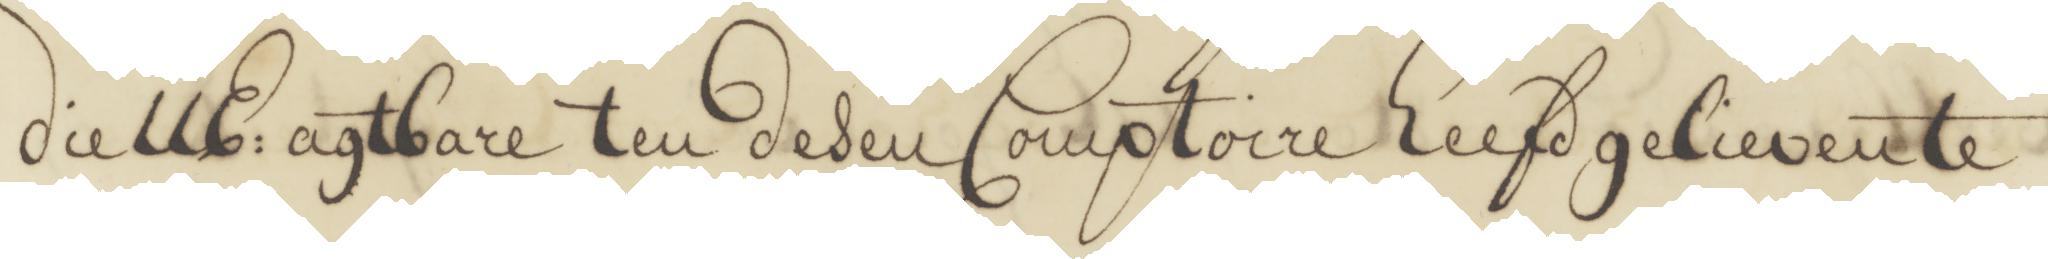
die UE: agtbare ten desen Comptoire heefd gelieven te
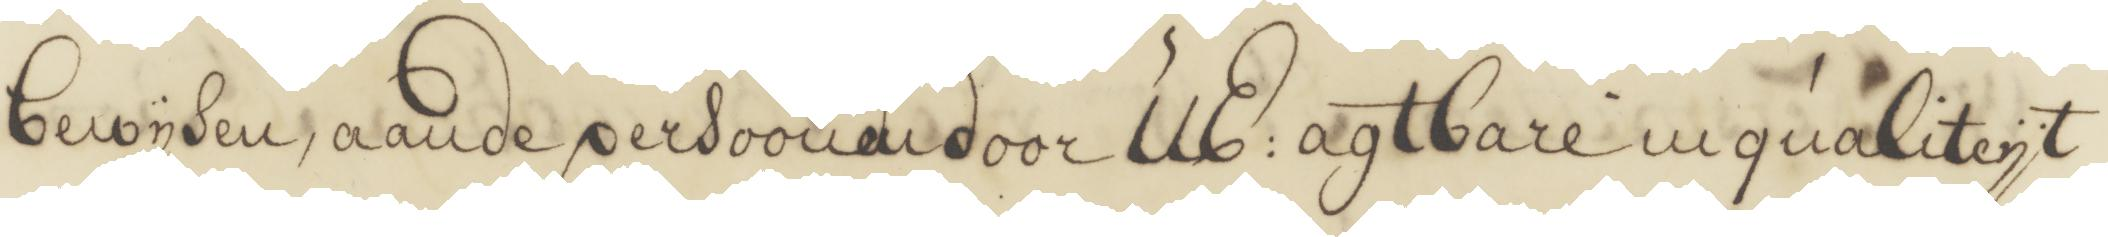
bewijsen, aande persoonen door UE: agtbare in qualiteijt
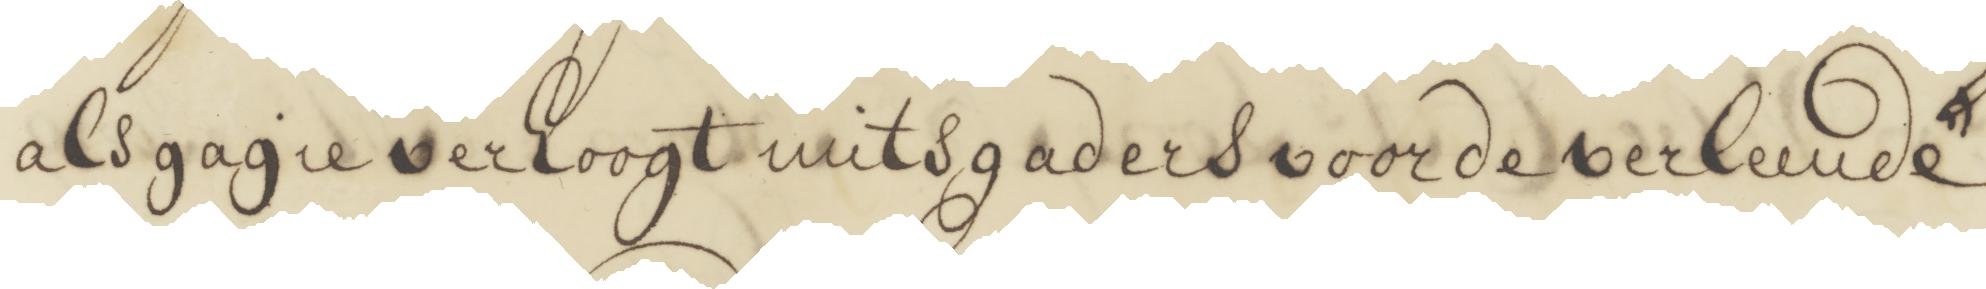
als gagie verhoogt mitsgaders voor de verleende
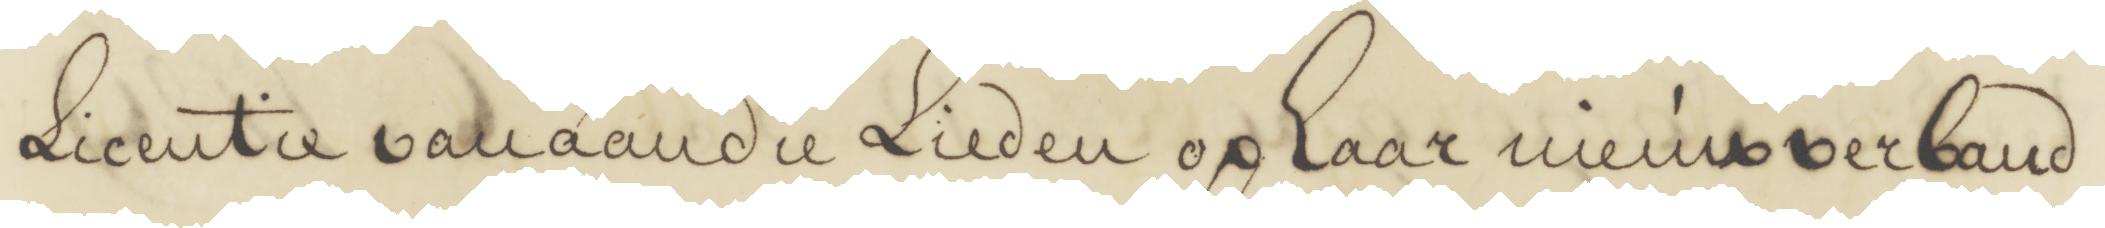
Licentie van aan die Lieden op haar nieuw verband
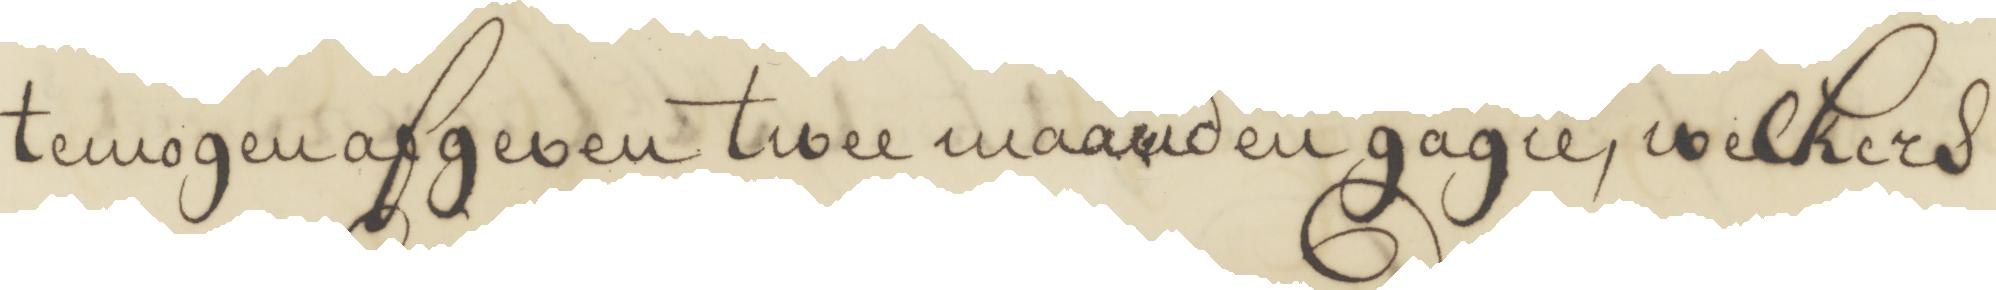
temogen afgeven twee maanden gagie, welkers
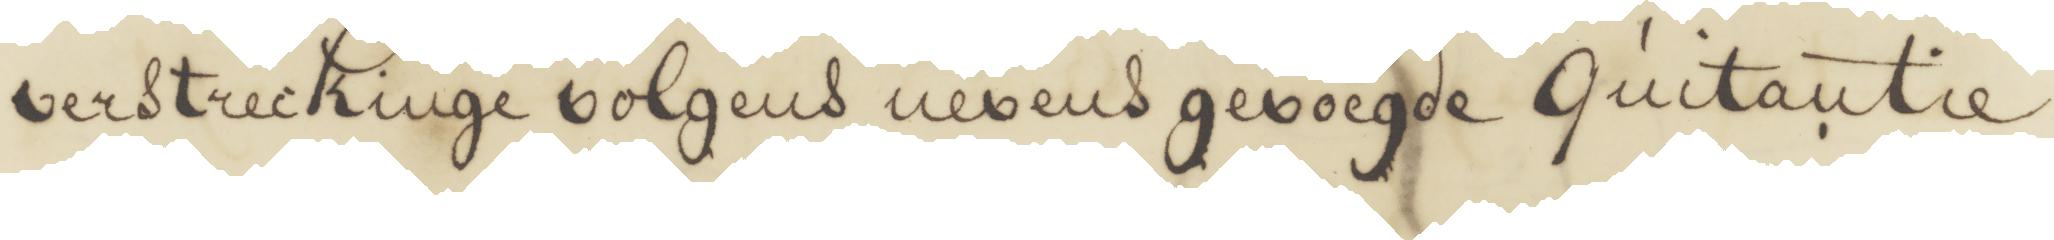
verstreckinge volgens nevens gevoegde quitantie
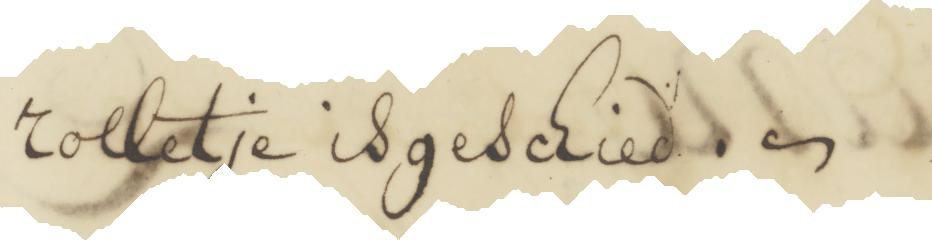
rolletje is geschied. —
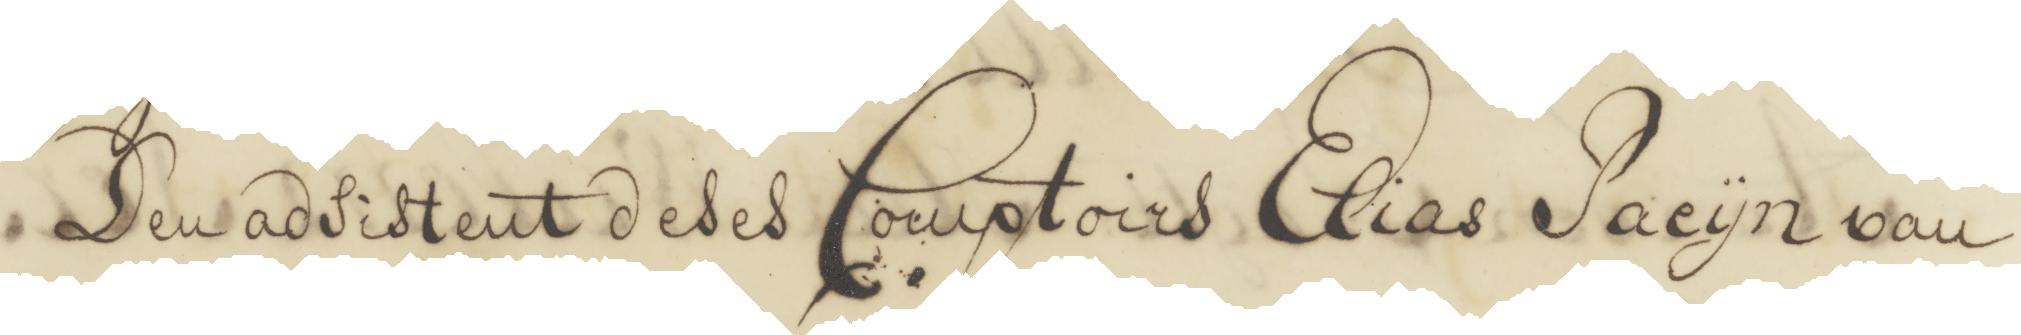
Den adsistent deses Comptoirs Elias Paeijn van
